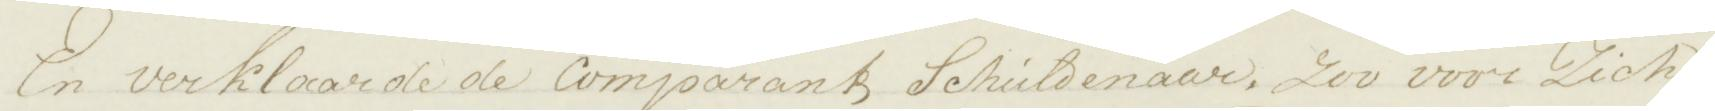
En verklaarde de comparant schuldenaar, zoo voor zich
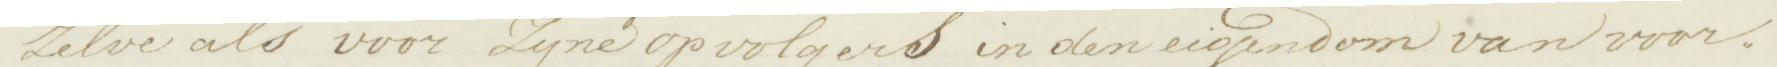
zelve als voor zyne opvolgers in den eigendom van voor„
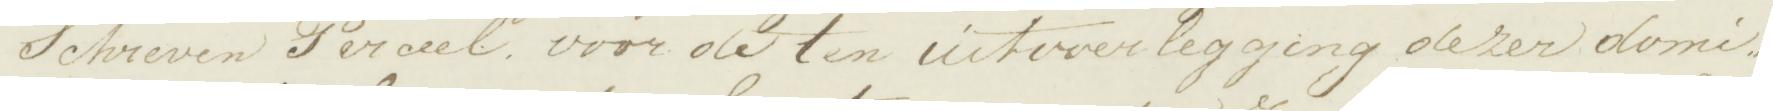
schreven Perceel, voor de ten uitvoerlegging dezer domi„
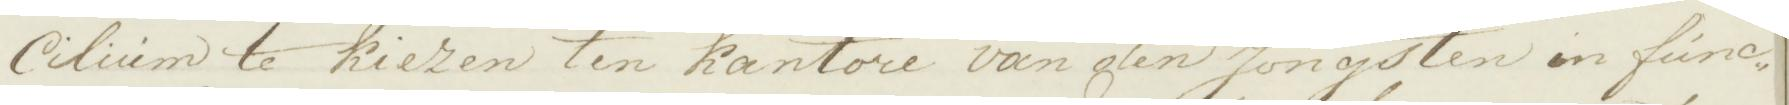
cilium te kiezen ten kantore van den Jongsten in func„
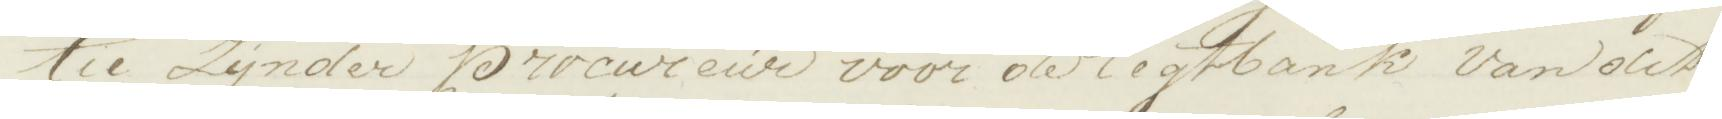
tie zijnder procureur voor deRegtbank van dit
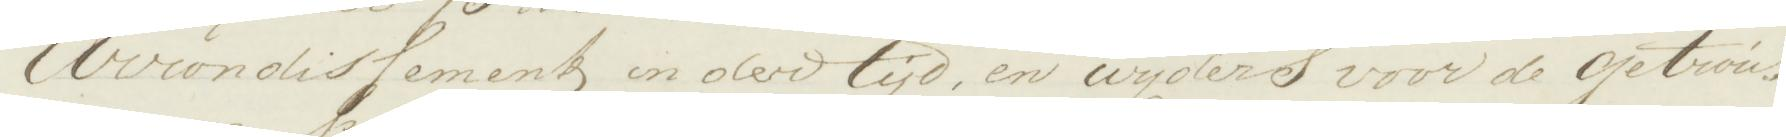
Arrondissement in der tijd, en wyders voor de getrou„
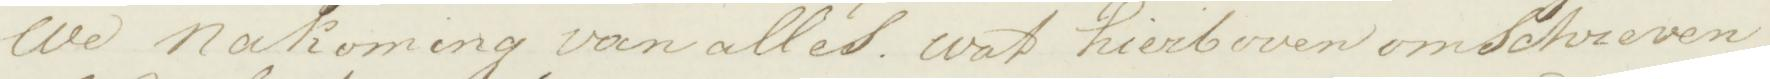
we nakoming van alles, wat hierboven omschreven
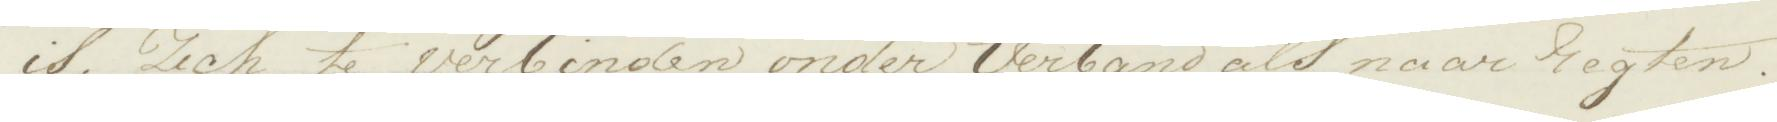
is. zich te verbinden onder Verband als naar Regten.
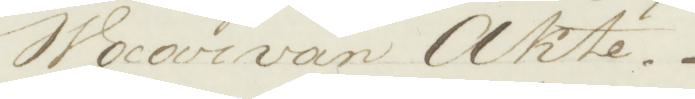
Waar van Akte.
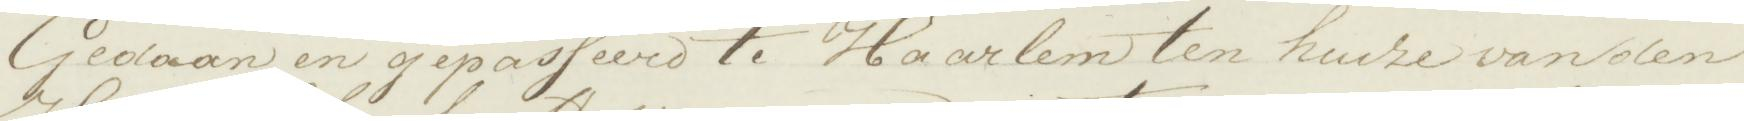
Gedaan en gepasseerd te Haarlem ten huize van den
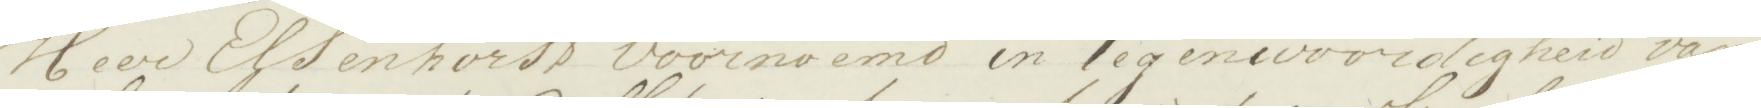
Heer Elsenhorst voornoemd in tegenwoordigheid van
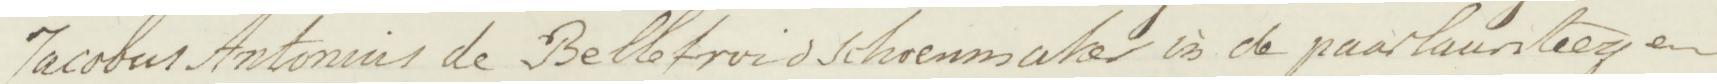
Jacobus Antonius de Bellefroid schoenmaker in de paarlaarsteeg en
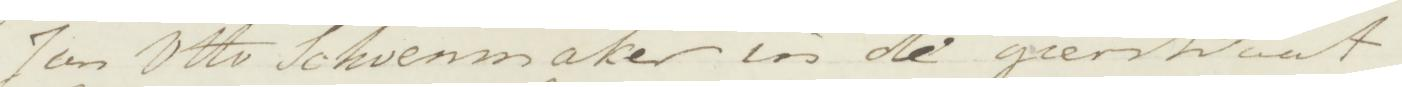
Jan Otto schoenmaker in de gierstraat
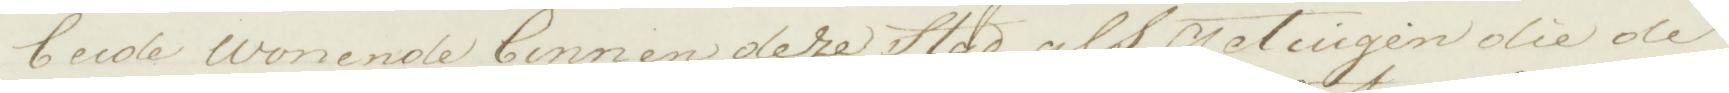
beide wonende binnen deze stad als getuigen die de
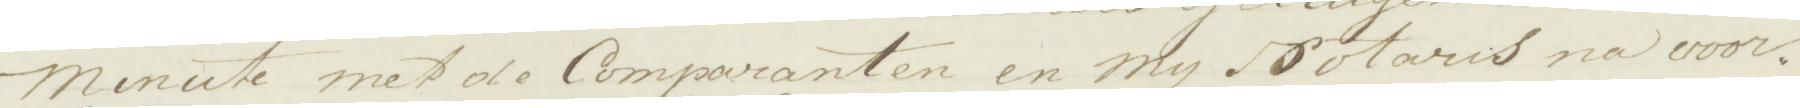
Minute met de Comparanten en my Notaris na voor„
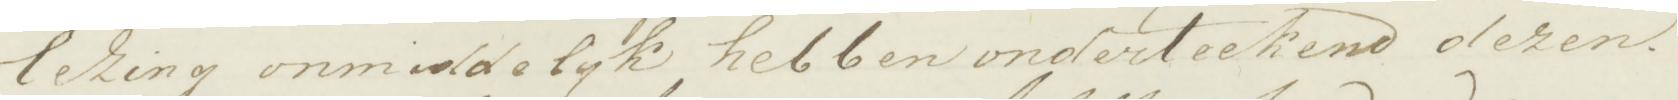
lezing onmiddelyk hebben onderteekend dezen.
